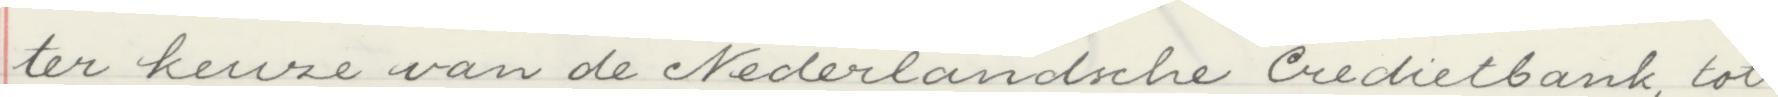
ter keuze van de Nederlandsche Credietbank, tot
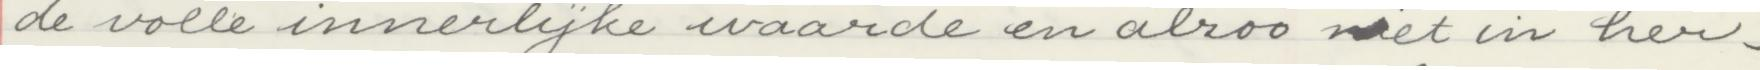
de volle innerlijke waarde en alzoo niet in her
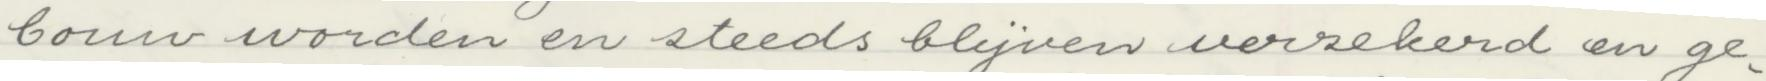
bouw worden en steeds blijven verzekerd en ge„
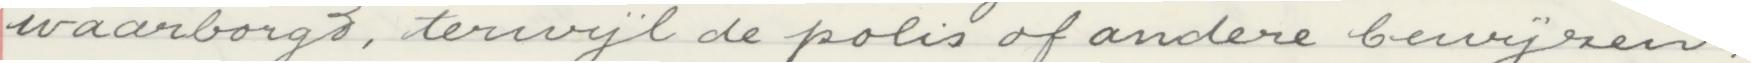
waarborgd, terwijl de polis of andere bewijzen,
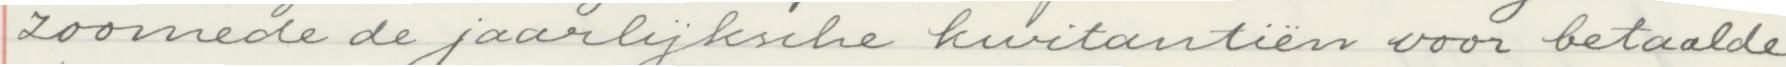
zoomede de jaarlijksche kwitantien voor betaalde
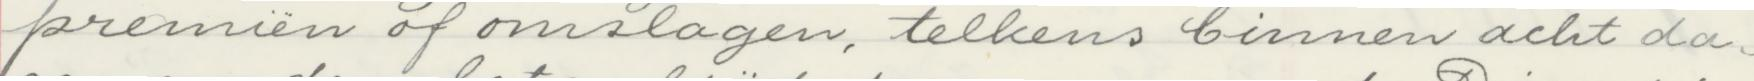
premiën of omslagen, telkens binnen acht da
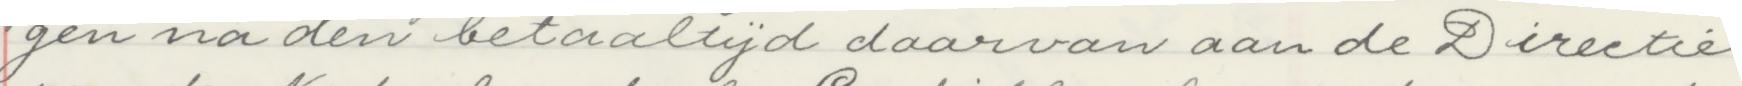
gen na den betaaltijd daarvan aan de Directie
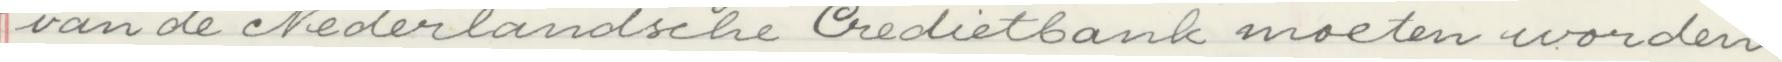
van de Nederlandsche Credietbank moeten worden
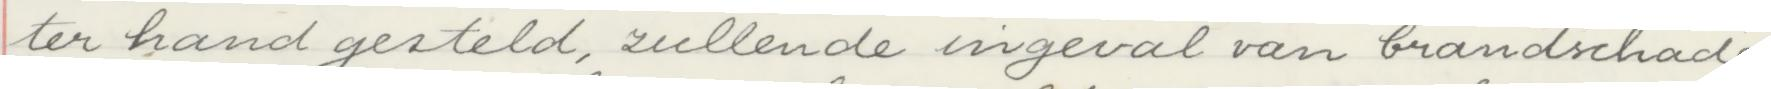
ter hand gesteld, zullende ingeval van brandschade
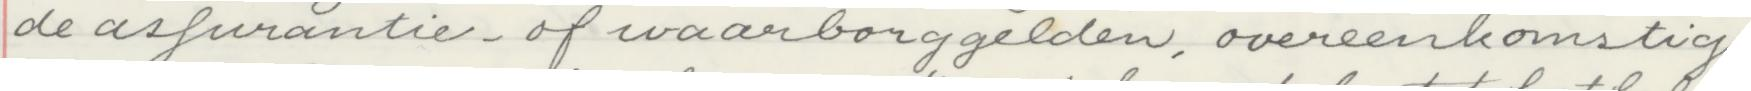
de assurantie - of waarborggelden, overeenkomstig
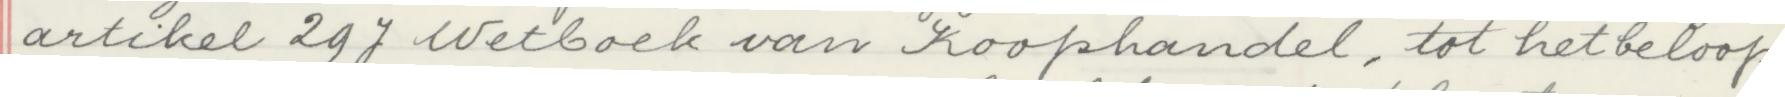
artikel 297 Wetboek van Koophandel, tot het beloop
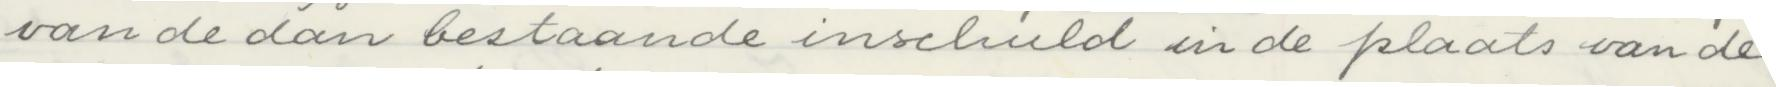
van de dan bestaande inschuld in de plaats van de
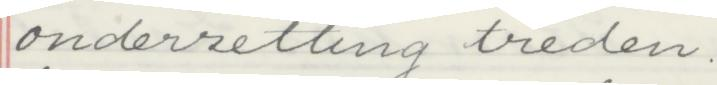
onderzetting treden.
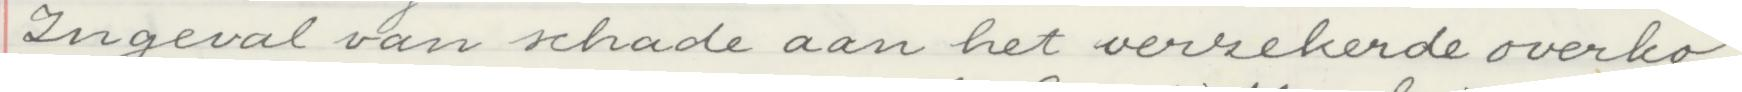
Ingeval van schade aan het verzekerde overko
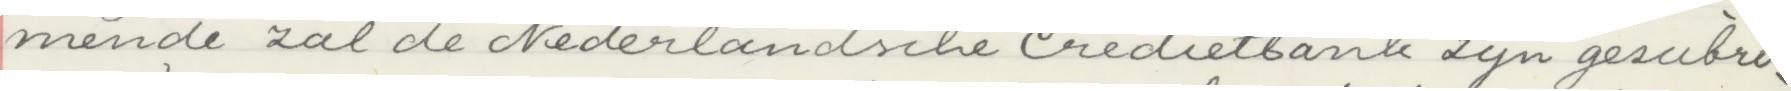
mende zal de Nederlandsche Credietbank zijn gesubro
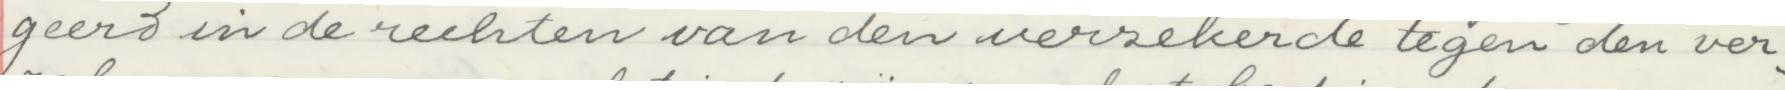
geerd in de rechten van den verzekerde tegen den ver
